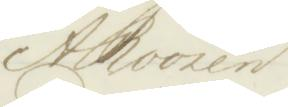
A Roozen
